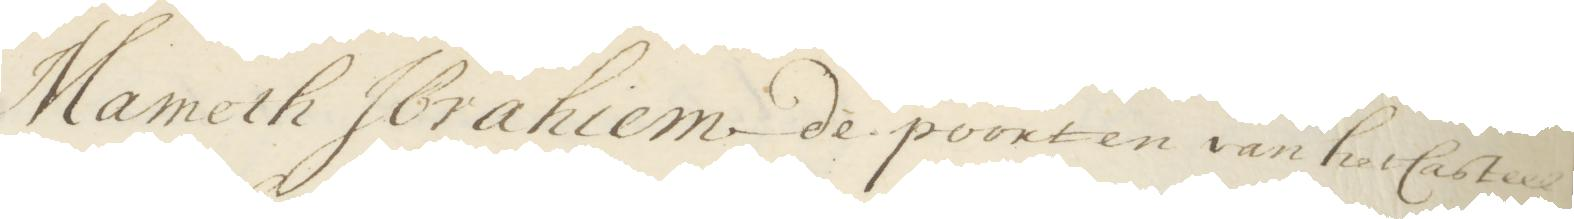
Mameth Jbrahiem de poorten van het Casteel
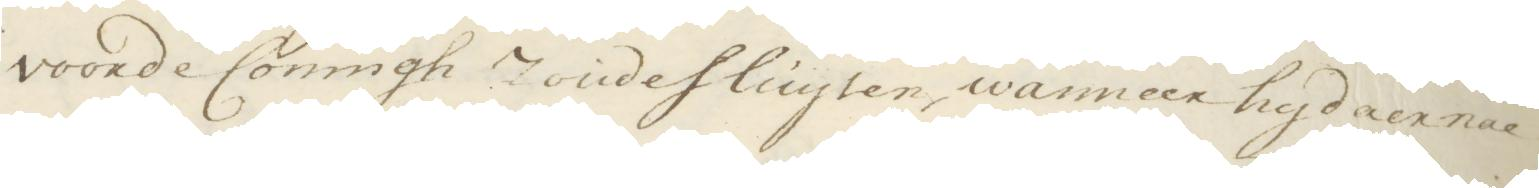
voor de Coningh zoude sluijten, wanneer hy daer nae
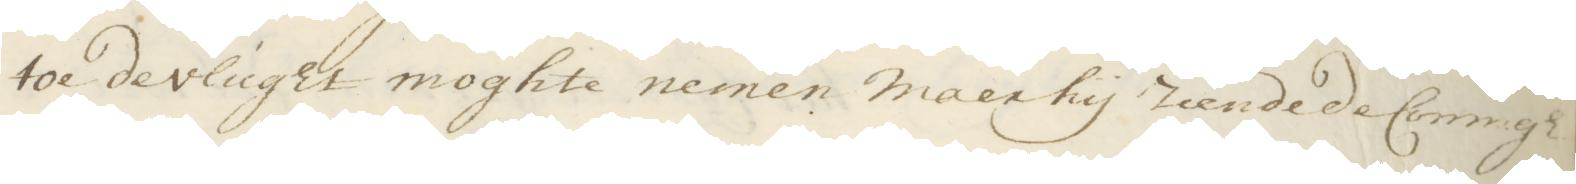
toe de vlught moghte nemen maer hij ziende de Coningh
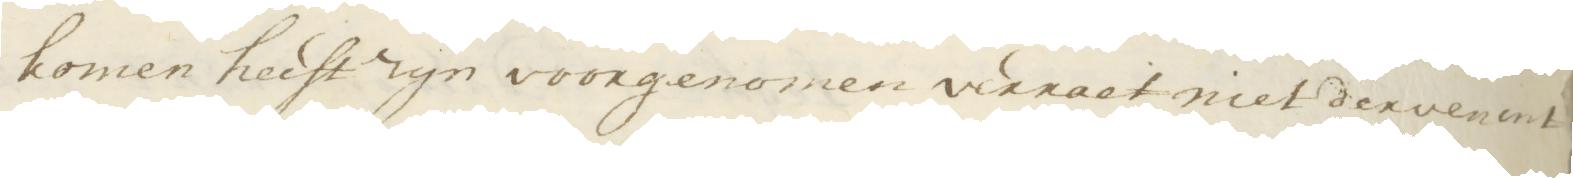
komen heeft zijn voorgenomen verraet niet derven int
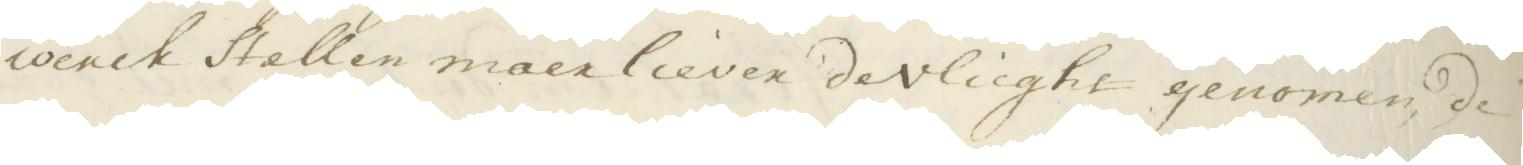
werck stellen maer liever de vlught genomen, de
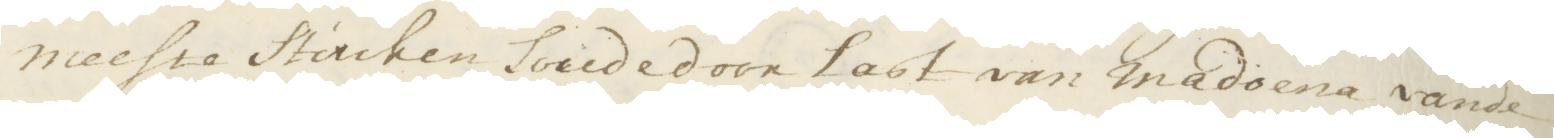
meeste stucken soude door last van madoena vande
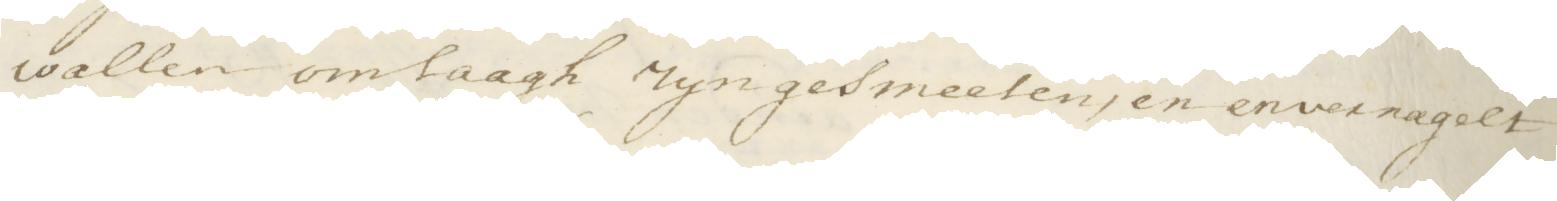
wallen om laagh zyn gesmeeten, en envernagelt
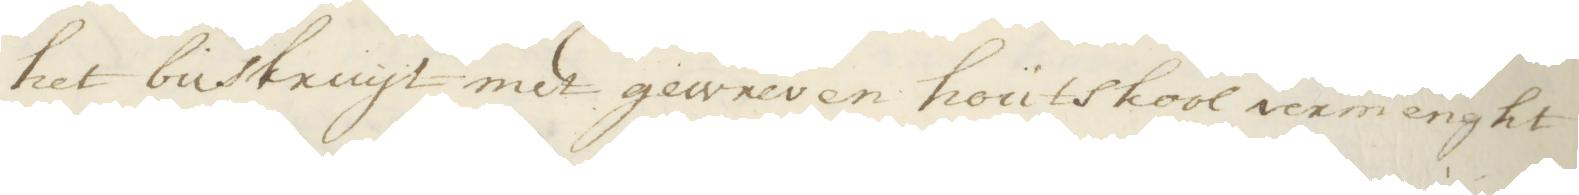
het buskruijt met gewreven houtskool vermenght
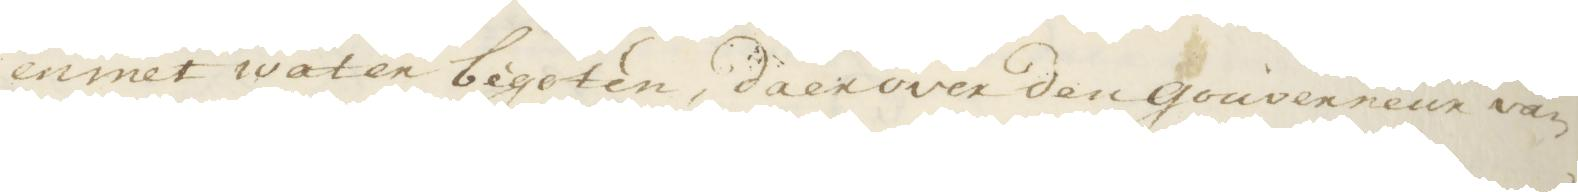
en met water begoten, daerover den gouverneur van
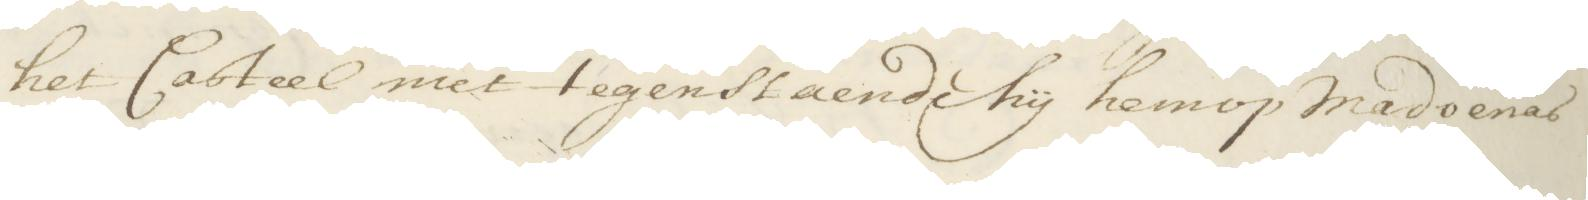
het Casteel niet tegenstaende hij hem op madoenas
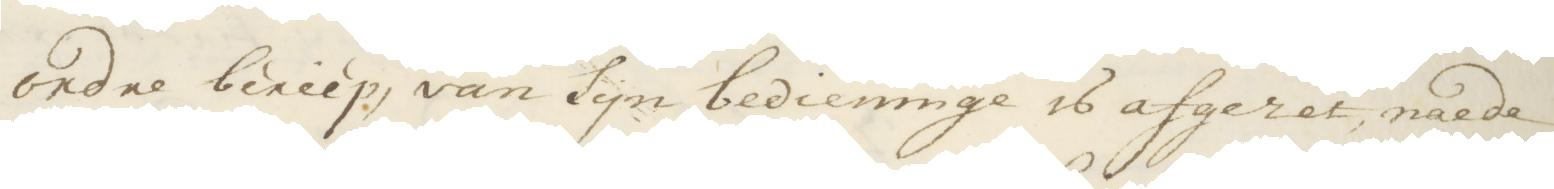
ordre beriep van sijn bedieninge is afgezet, nae de
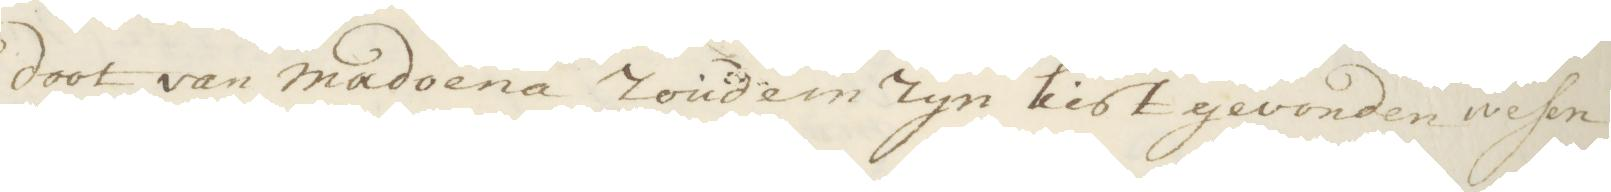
doot van madoena zouden zijn kist gevonden wesen
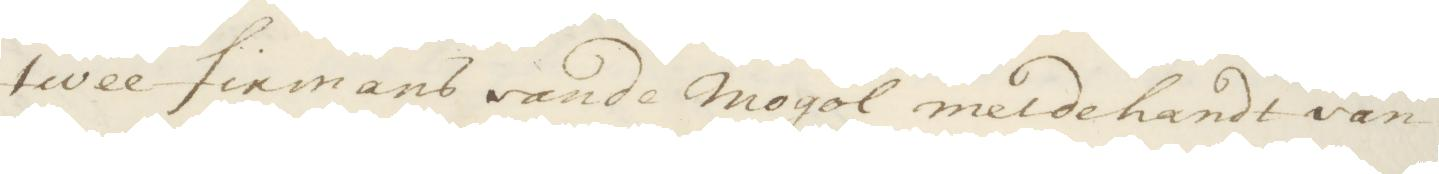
twee firmans vande mogol met de handt van
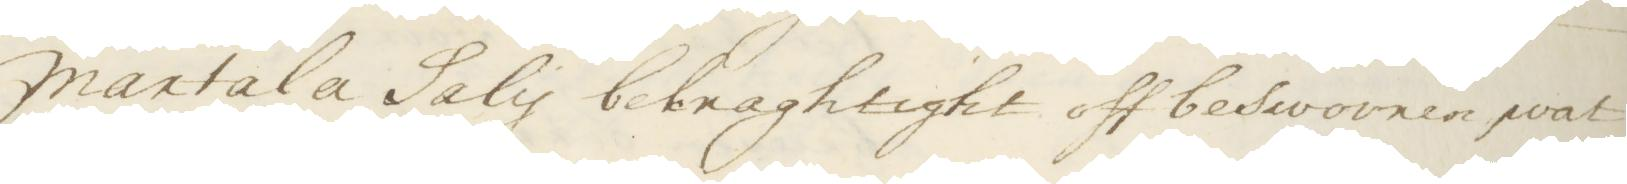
Martala Salij bekraghtight off beswooren wat
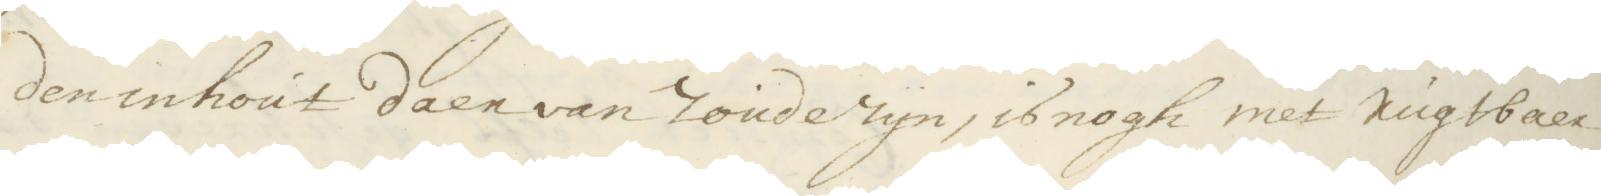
den inhout daer van zoude zijn, is nogh niet rugtbaer
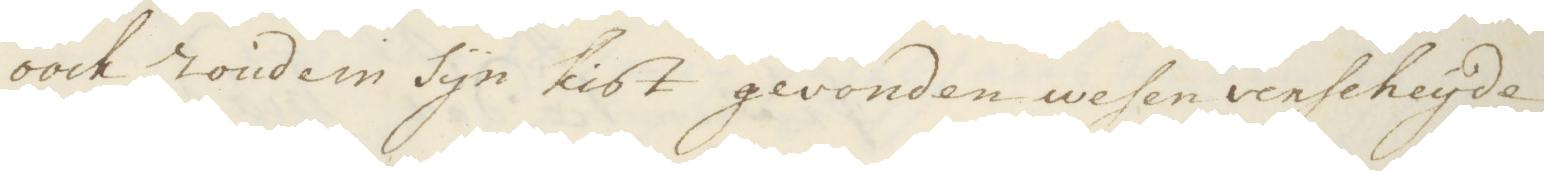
oock zoude in sijn kist gevonden wesen verscheijde
